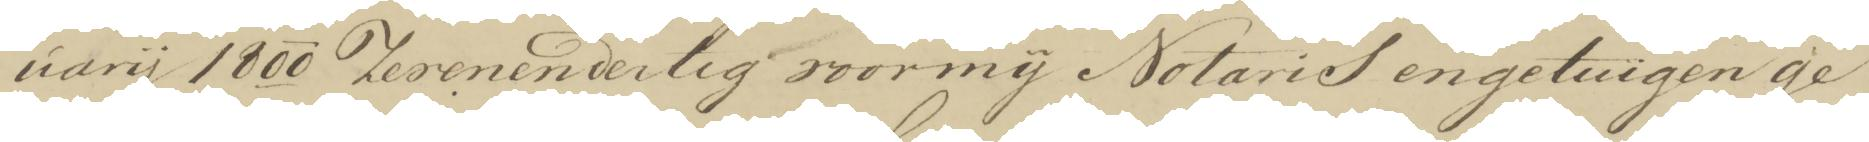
uarij 1800 Zevenendertig voor mij Notaris en getuigen ge
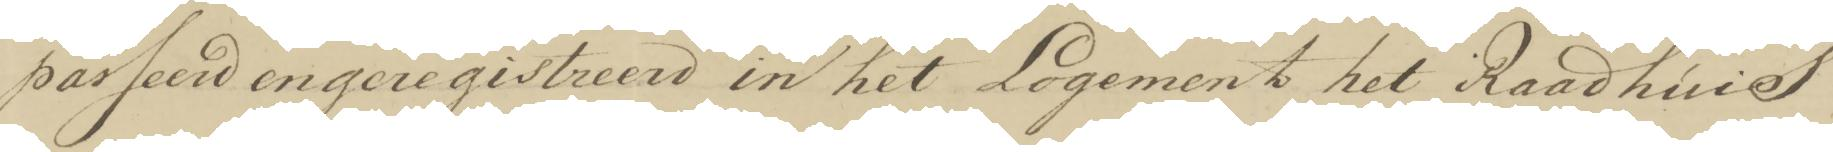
passeerd en geregistreerd in het Logement het Raadhuis
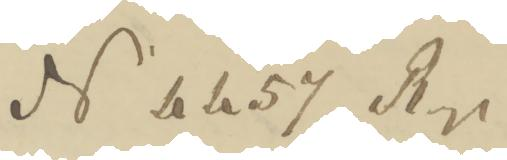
N' 4457 Reg
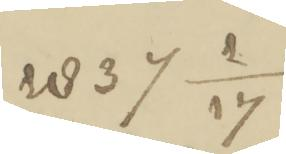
1837 2/17
